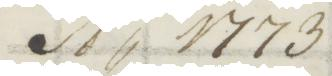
A„o 1773
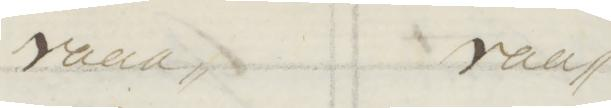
vaar„ vaa
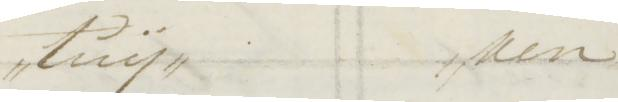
„tuij„ „ren
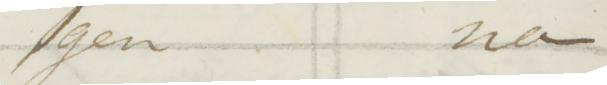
,gen na
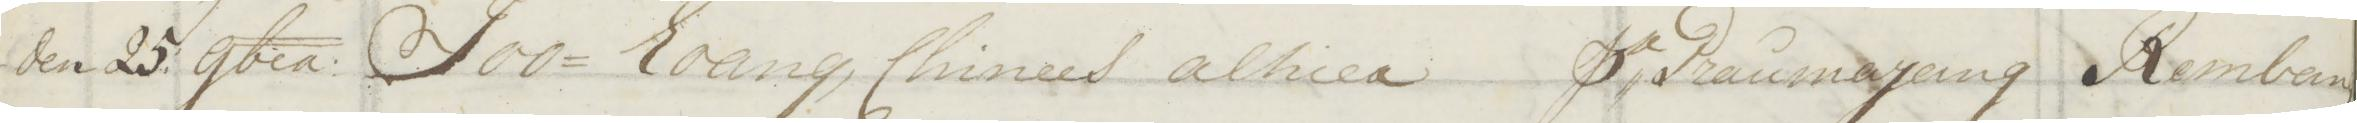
den 25:' 9ber: Joo= hoang, Chinees alhier p„r Praumajang Rembang
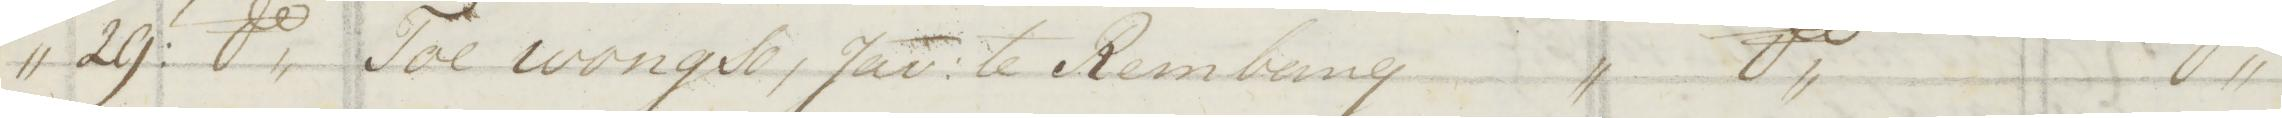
„ 29:' d„o Toe wongso, Jav: te Rembang „ d„o d„o
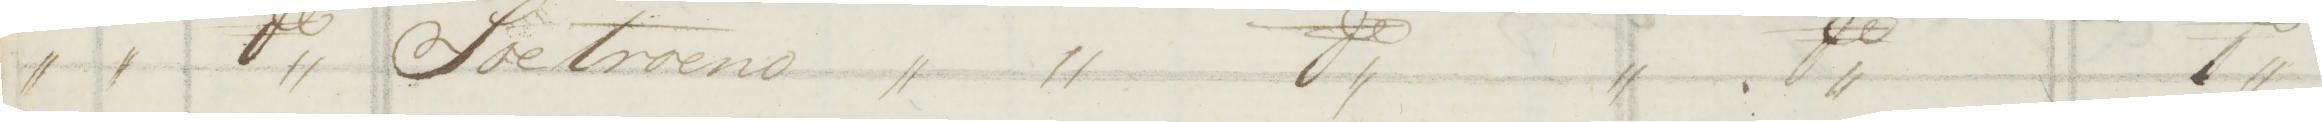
„ „ d„o Soetroeno „ „ d„o „ d„o d„o
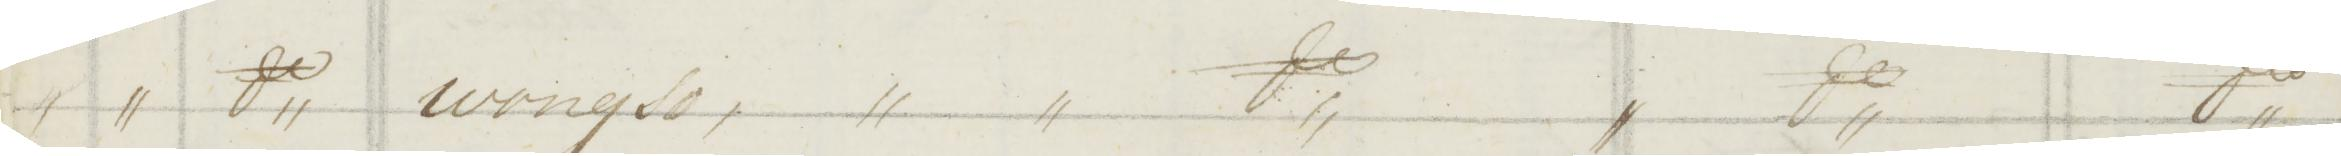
„ „ d„o wongso, „ „ d„o „ d„o d„o
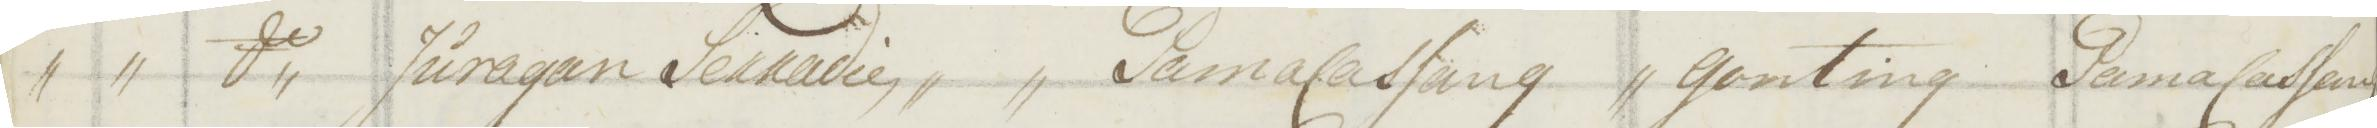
„ „ d„o Juragan Serradie, „ „ Pamacassang „ gonting Pamacassang
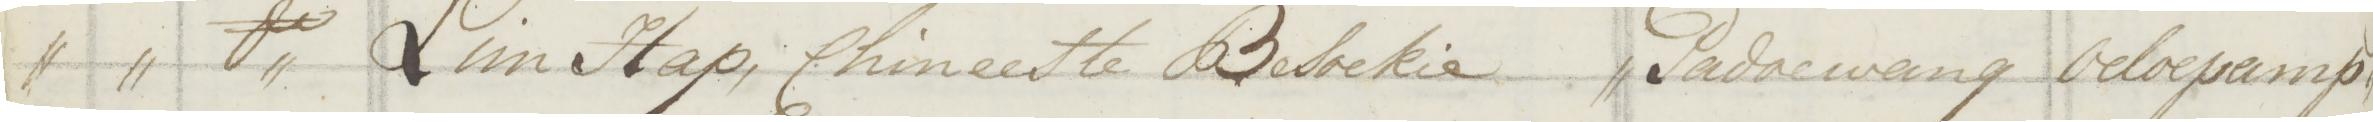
„ „ d„o Lim Hap, Chinees te Besoekie „ Padoewang oeloepamp„
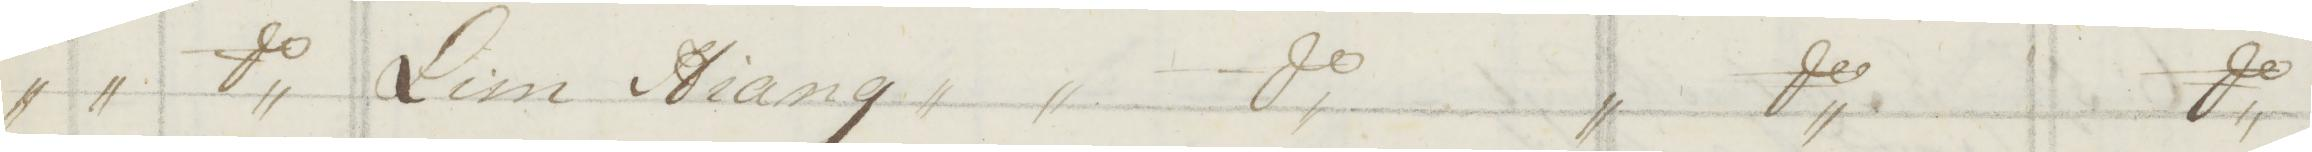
„ „ d„o Lim Hiang „ „ d„o „ d„o d„o
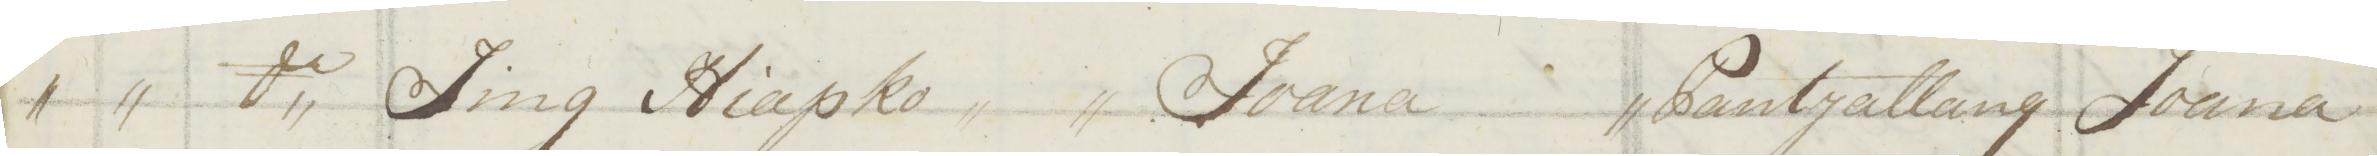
„ „ d„o Jing Hiapko „ „ Joana „ Pantjallang Joana
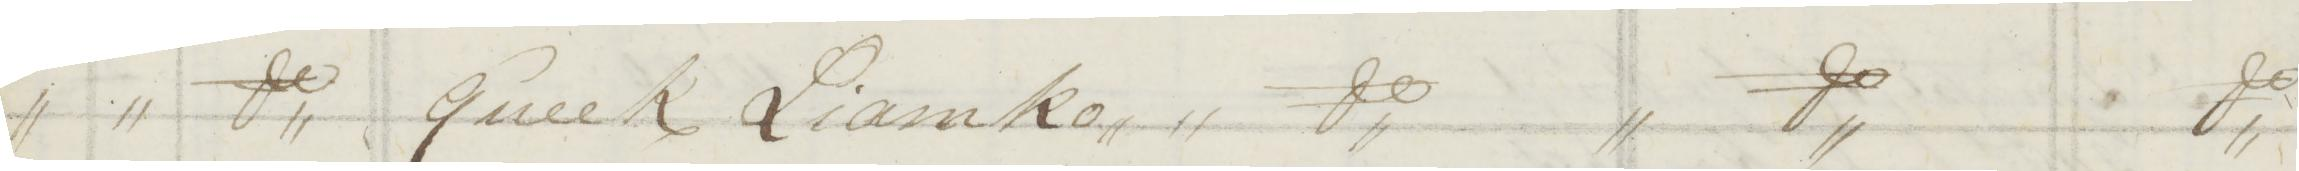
„ „ d„o queek Liamko „ „ d„o „ d„o d„o
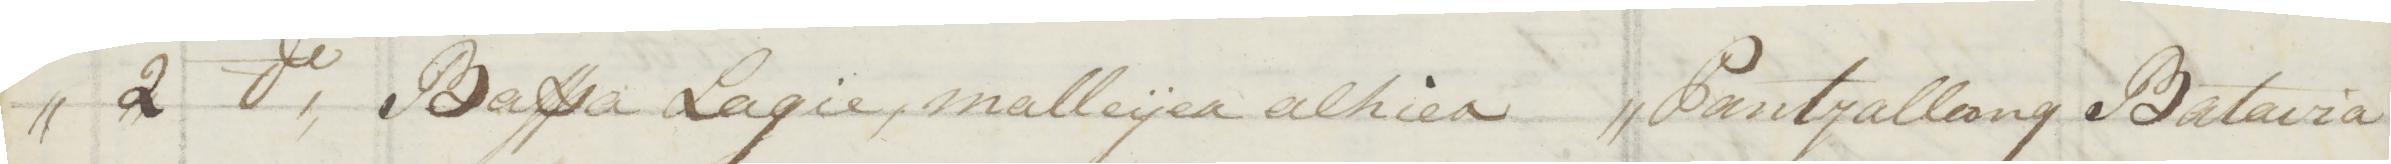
„ 2 d„o Bappa Lagie, malleijer alhier „ Pantjallang Batavia
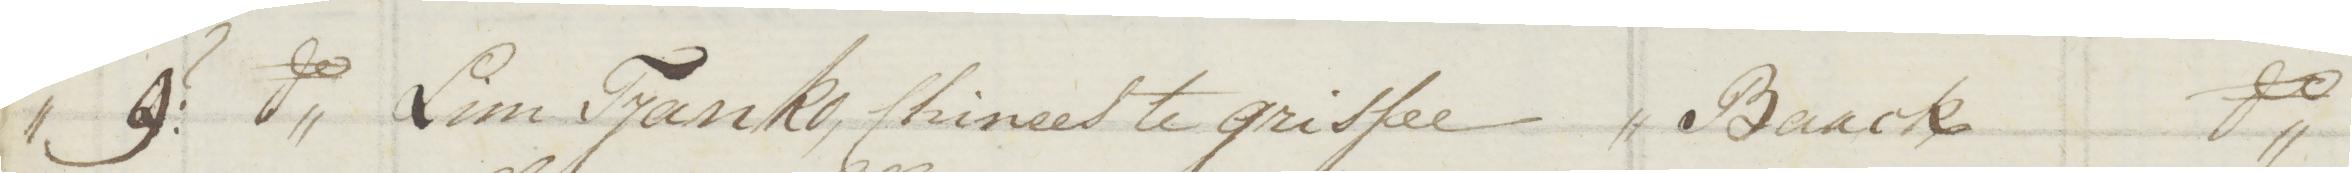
„ 9:' d„o Lim Tjanko, Chinees te grissee „ Barck d„o
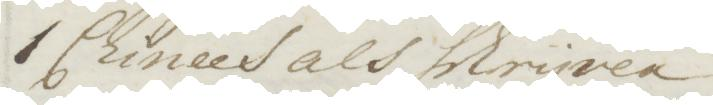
1 Chinees als schrijver
